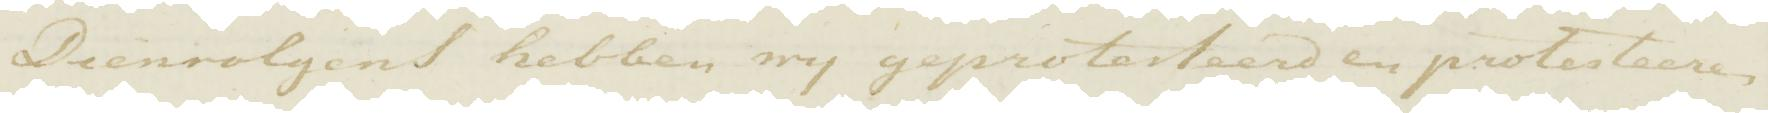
Dienvolgens hebben wy geprotesteerd en protesteeren
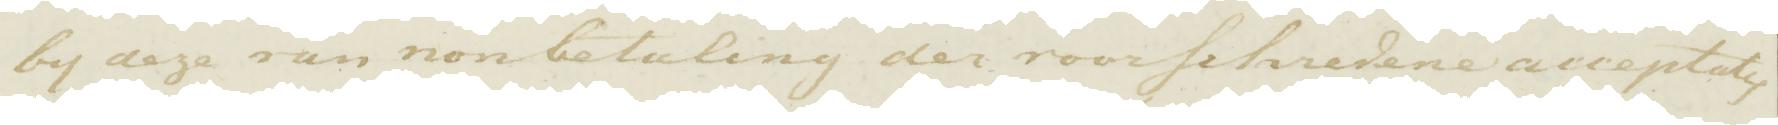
by deze van non betaling der voorschrevene acceptatie
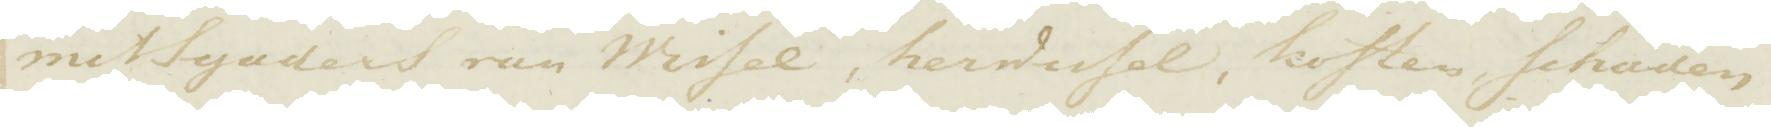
mitsgaders van Wissel, herwissel, kosten, schaden
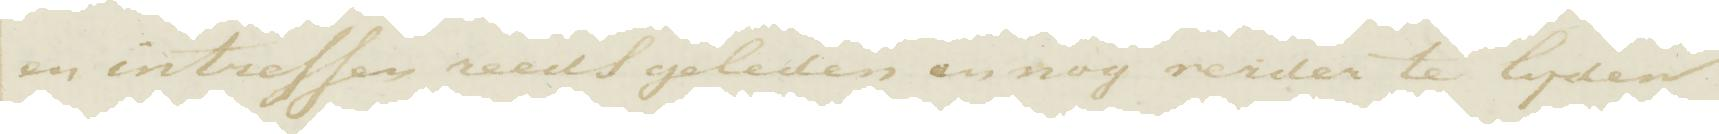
en intressen reeds geleden en nog verder te lyden.
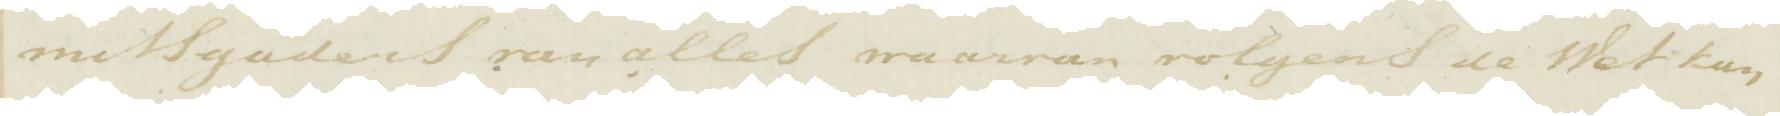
mitsgaders van alles waarvan volgens de Wet kan
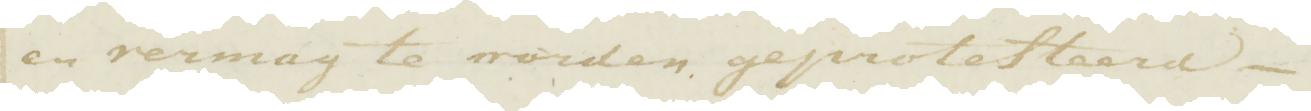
en vermag te worden geprotesteerd—
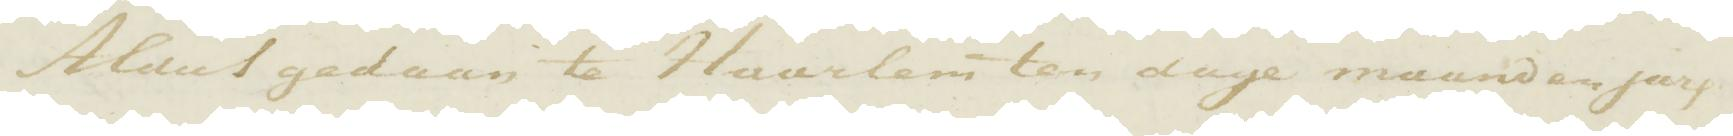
Aldus gedaan te Haarlem ten dage maand en Jare
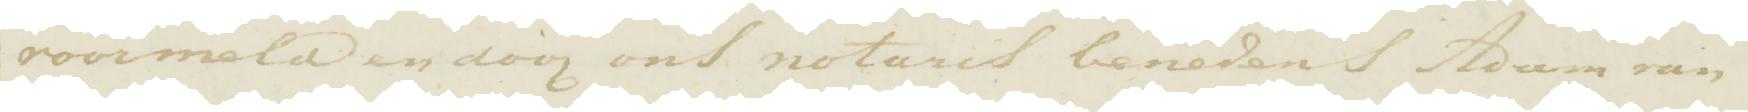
voormeld en door ons notaris benevens Adam van
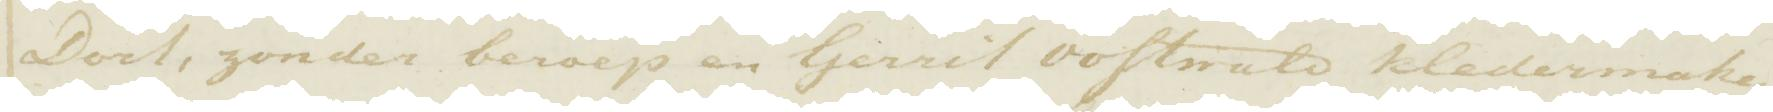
Dort, zonder beroep en Gerrit oostwald kledermaker
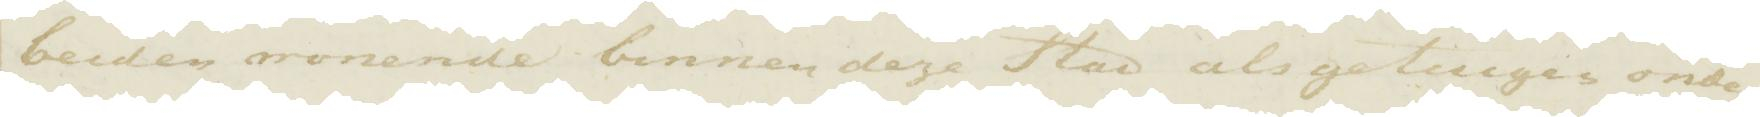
beiden wonende binnen deze Stad als getuigen onder
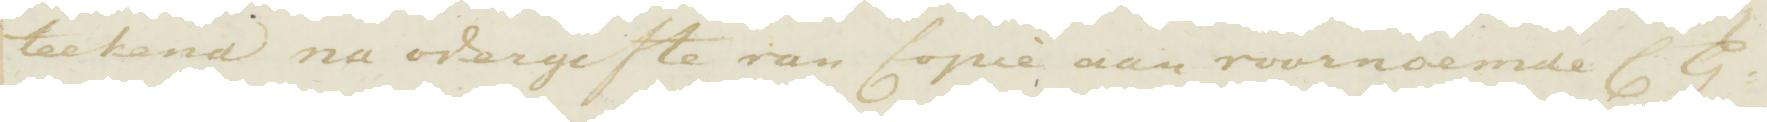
teekend na overgifte van Copie aan voornoemde C G
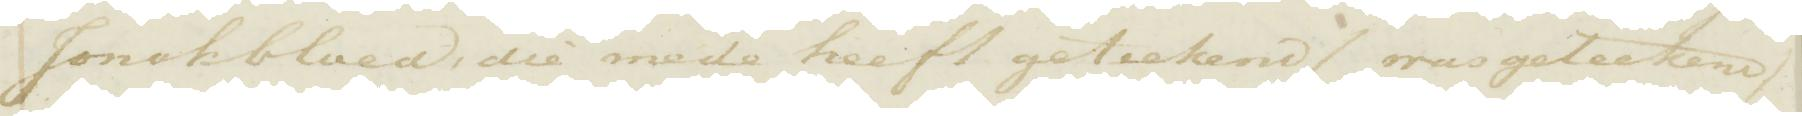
Jonckbloed, die mede heeft geteekend / was geteekend /
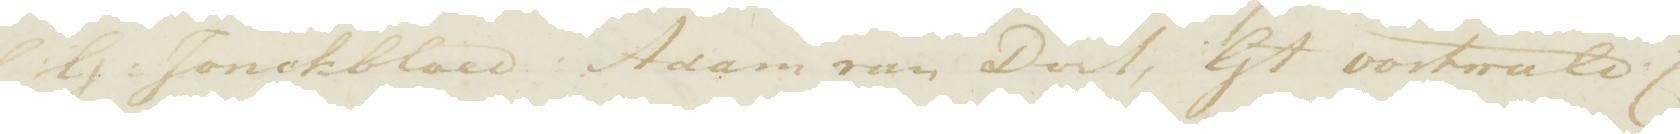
C: G: Jonckbloed, Adam van Dort, Gt oostwald C
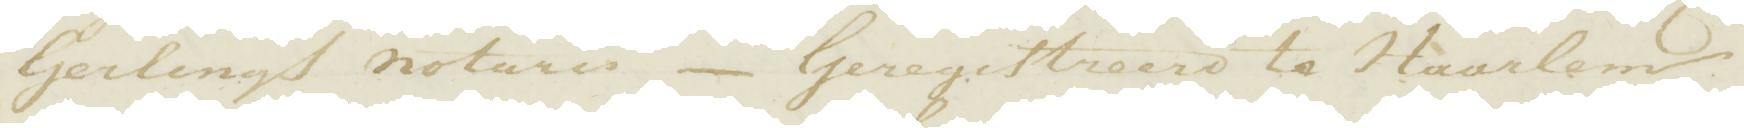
Gerlings notaris — Geregistreerd te Haarlem
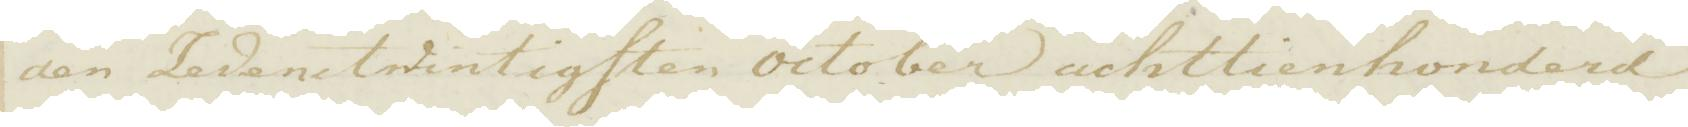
den zeven & twintigsten october achttienhonderd
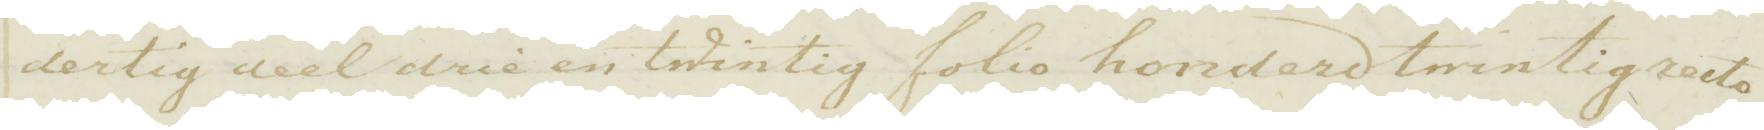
dertig deel drie en twintig folio honderd twintig recto
